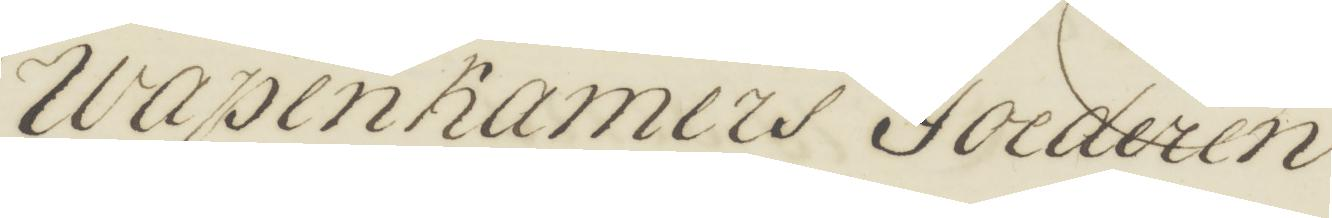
wapenkamers Goederen
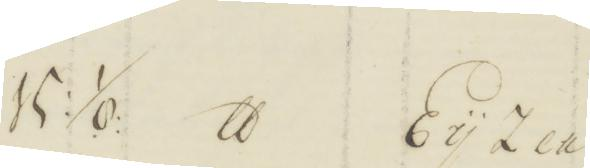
15:1/8: lb Eijzer
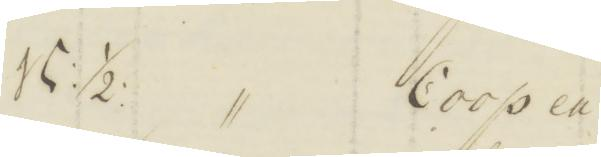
15:½: „ Cooper
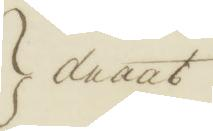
draat
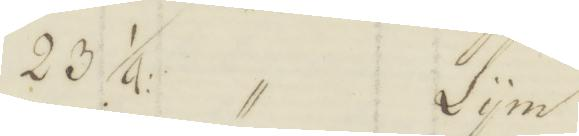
23.¼: „ Lijm
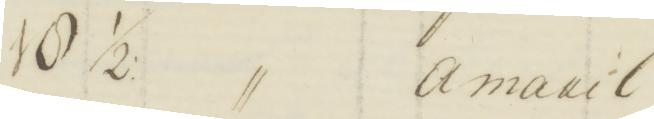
18½. „ Amaril
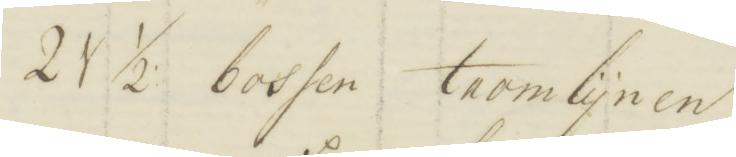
21½: bossen tromlijnen
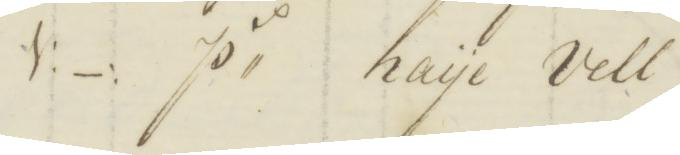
1:—: p„s haije vell
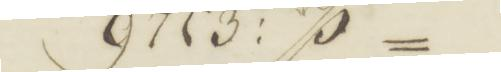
9753: p=s
